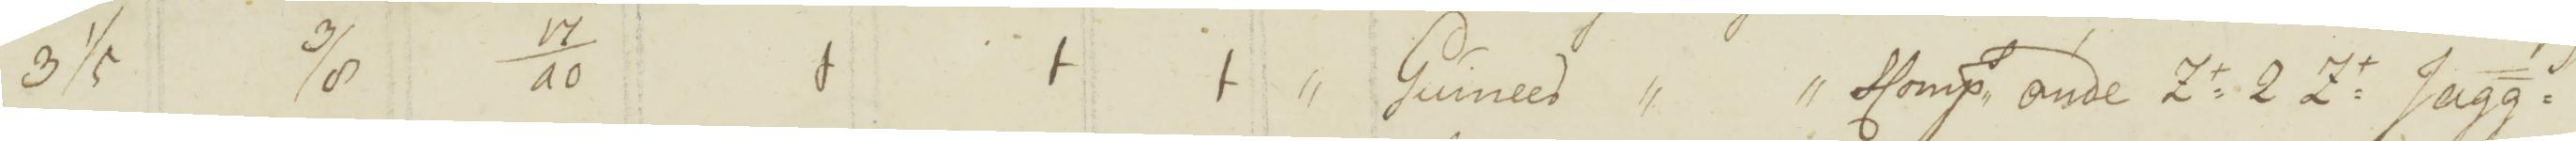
3 1/5 3/8 17/40 1 1 1 „ Guinees „ „ sComp„s oude z:t 2 z:t Jagg=s
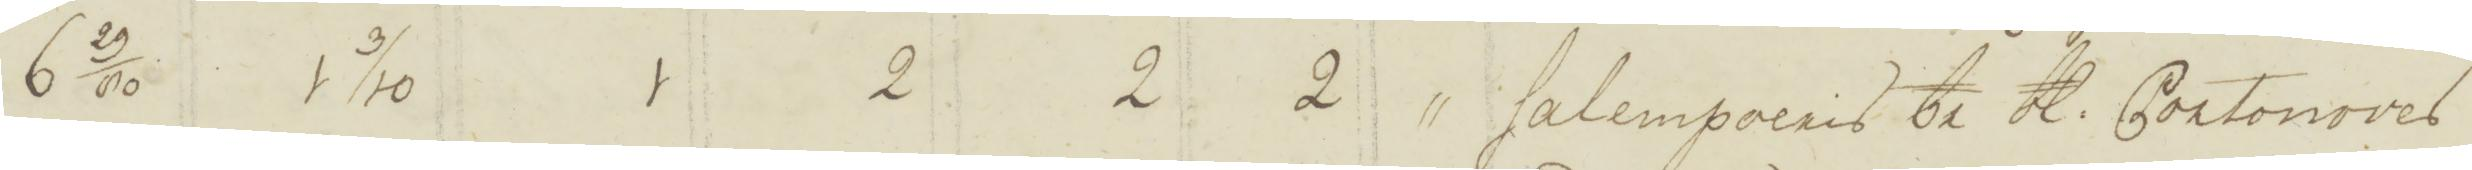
6 29/80 1 3/10 1 2 2 2 „ salempoeris br bl: Portonoves
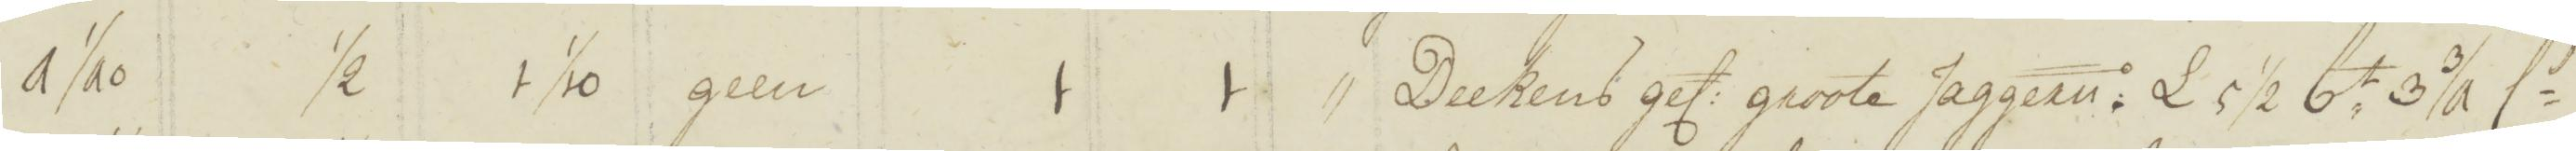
4 1/40 ½ 1 1/10 geen 1 1 „ Deekens geC: groote Jaggern:o L 5½ b„t 3¾ C=s
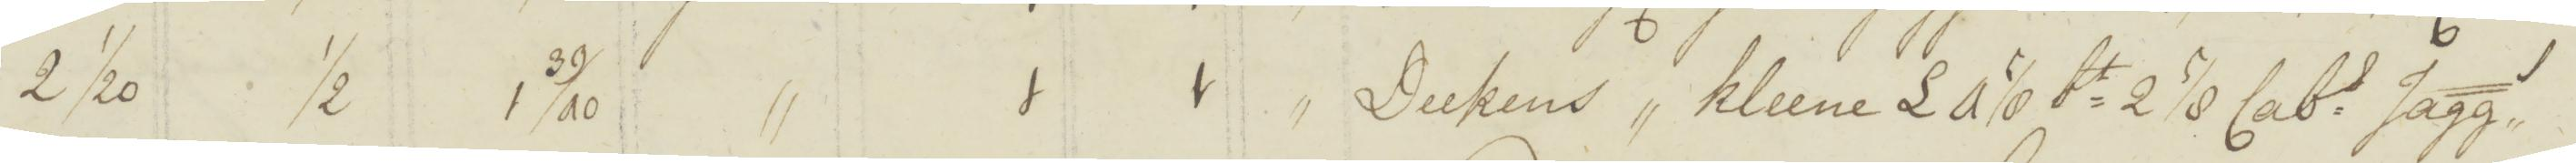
2 1/20 ½ 1 39/40 „ 1 1 „ Deekens „ kleene L 4 5/8 b=t 2 5/8 Cab=s Jagg„s
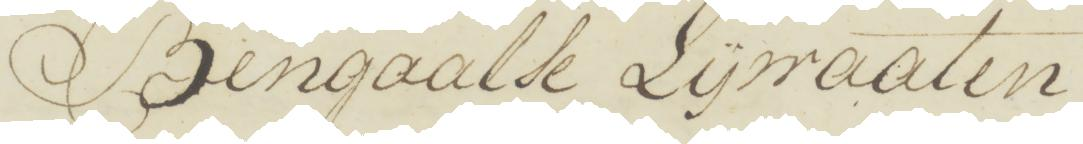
Bengaalse Lijwaaten
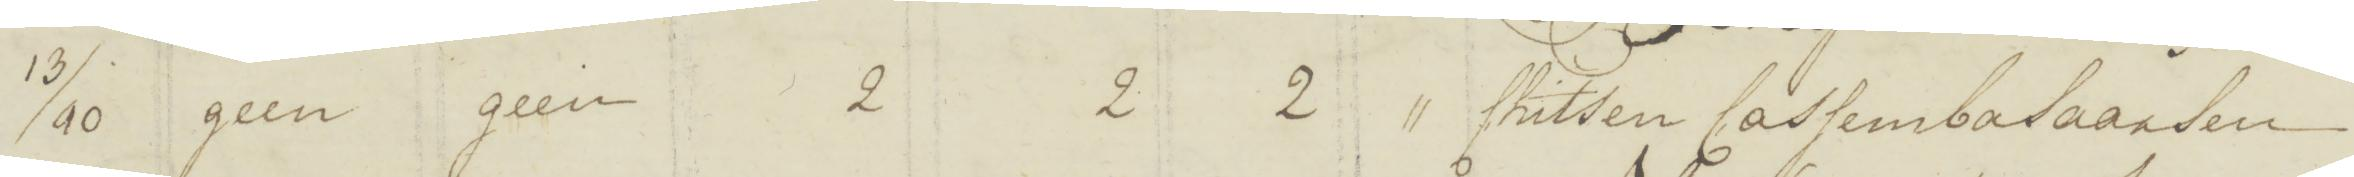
13/40 geen geen 2 2 2 „ Chitsen Cassembasaarsen
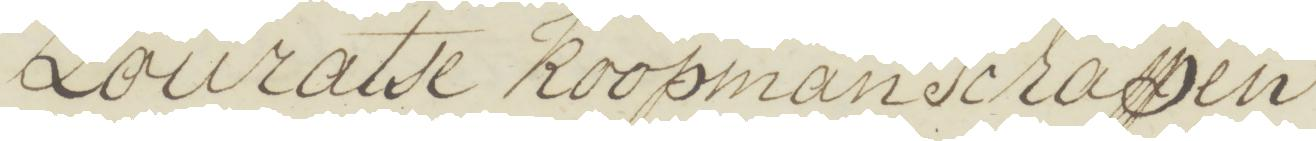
Zouratse koopmanschappen
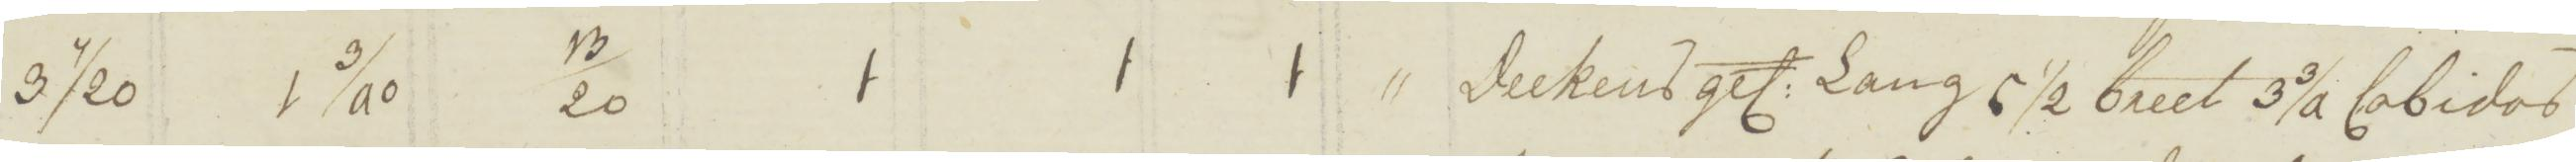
3 7/20 1 3/40 13/20 1 1 1 „ Deekens geC: Lang 5½ breet 3¾ Cobidos
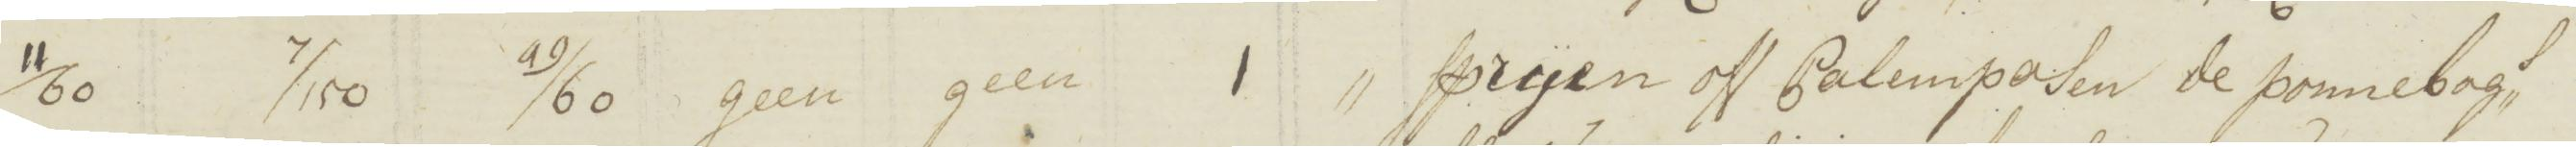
1/60 7/150 49/60 geen geen 1 „ sprijen of Palemposen de ponnebog„s
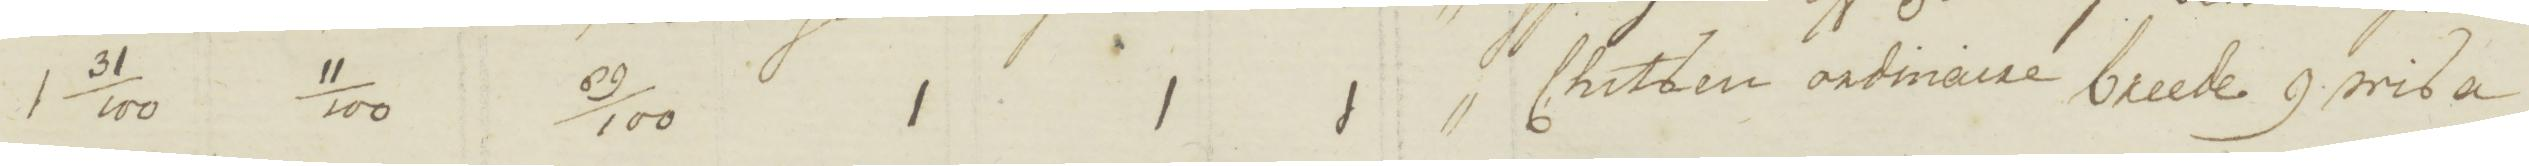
1 31/100 11/100 69/100 1 1 1 „ Chitsen ordinaire breede 9 wis a
